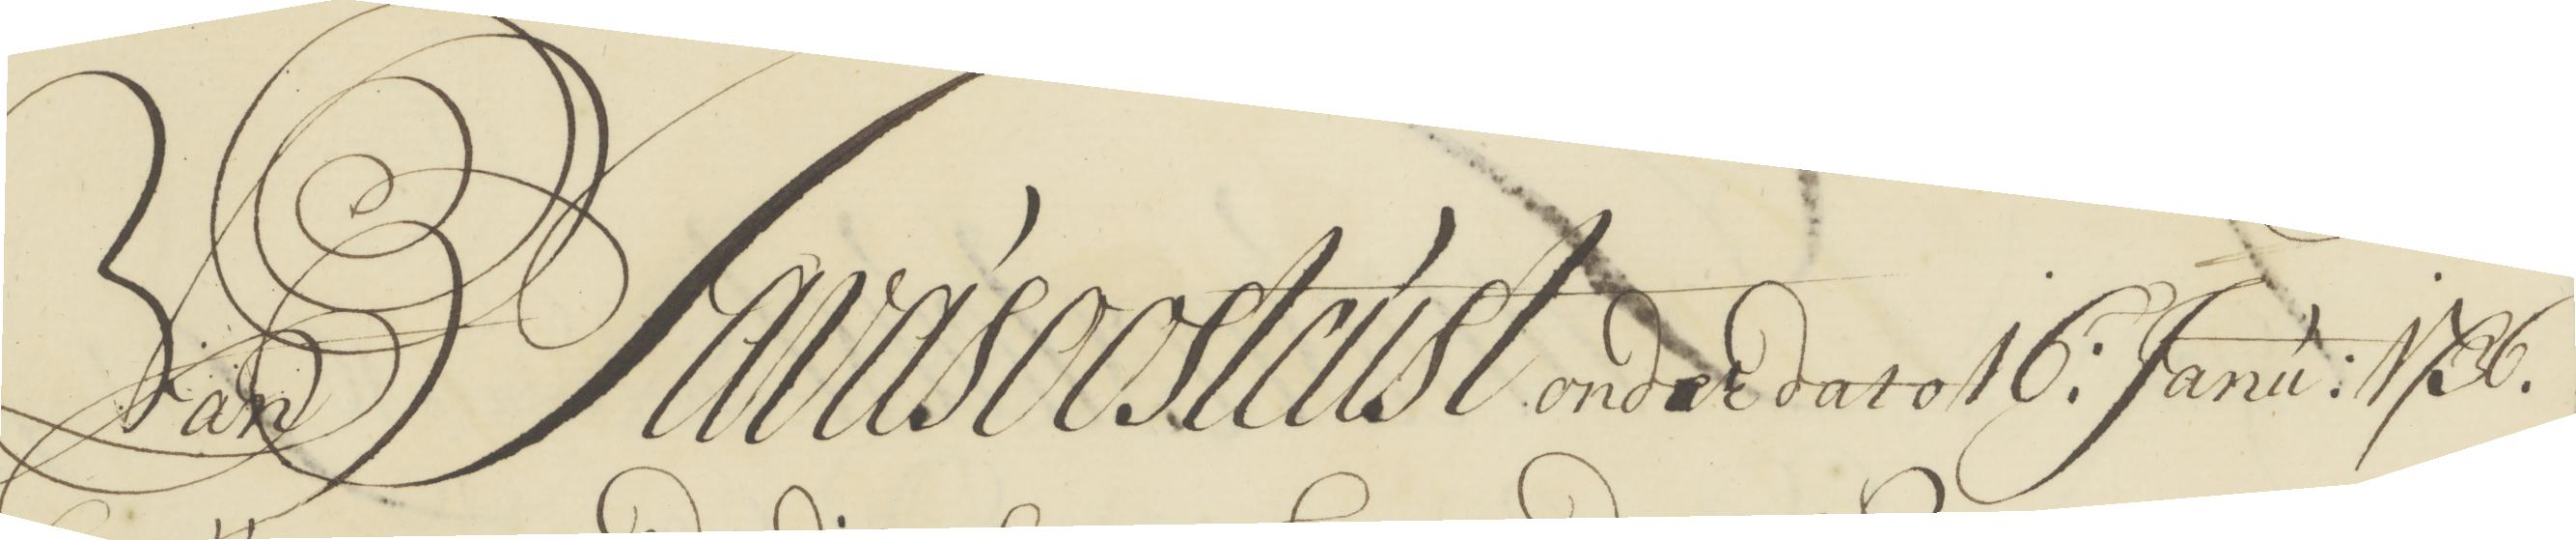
Van Java's oostcust onder dato 16: Janu: 1736.
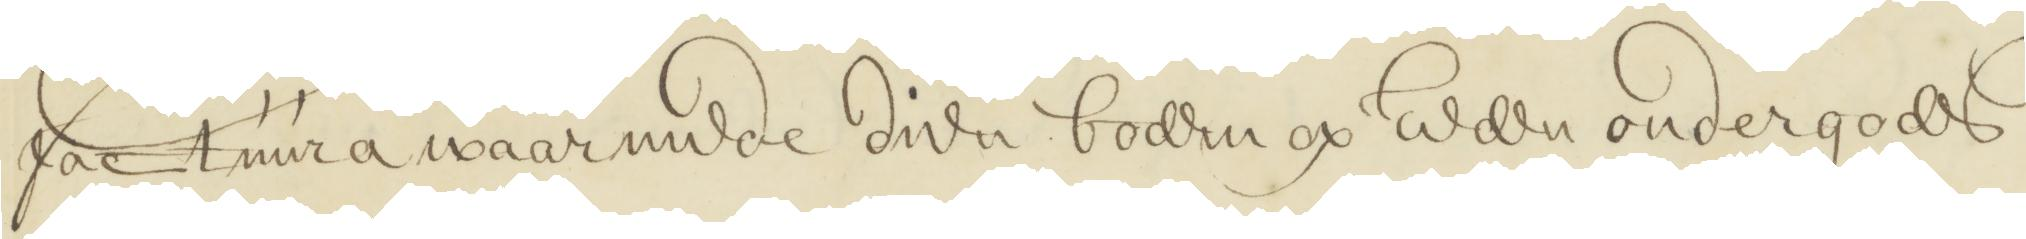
factuura waarmede dien bodem op heden onder godes
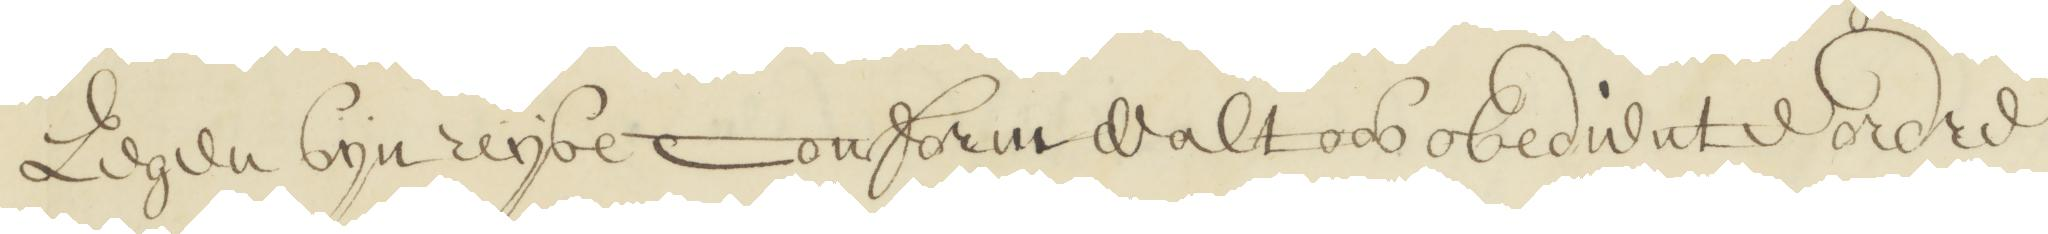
zegen sijn reijse conform de altoos obediente ordre
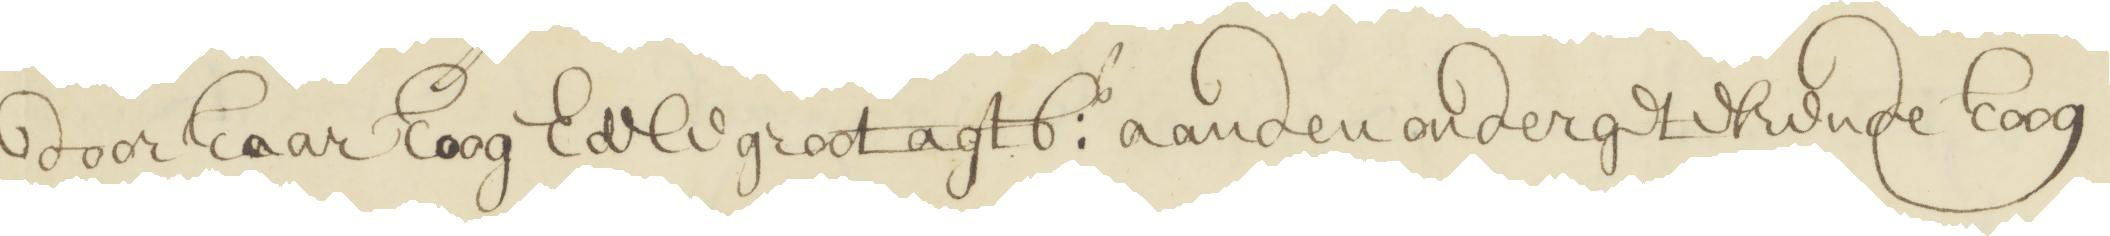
door haar hoog Edele groot agtb:s aanden ondergetekende hoog
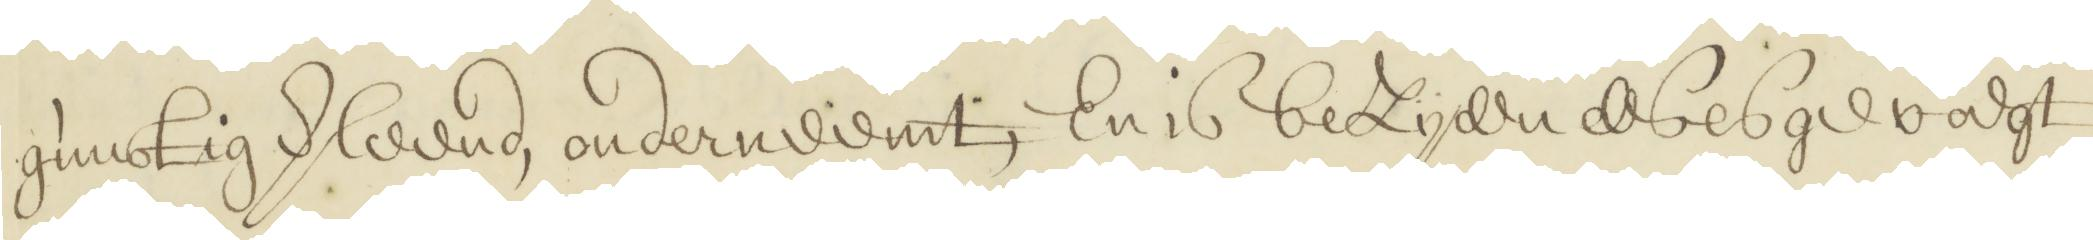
gunstig verleend, onderneemt, En is bezijden deses gevoegt
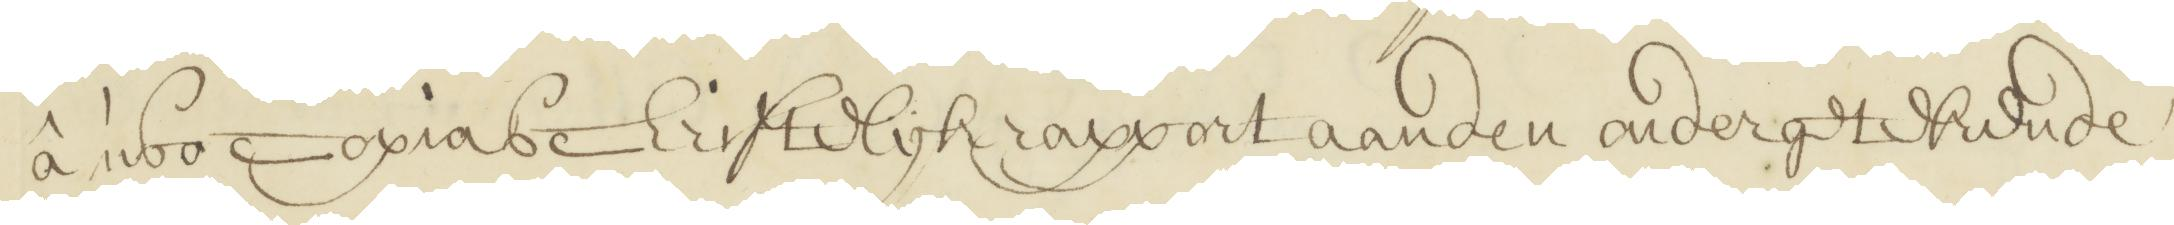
â uso copia schriftelijk rapport aan den ondergetekende
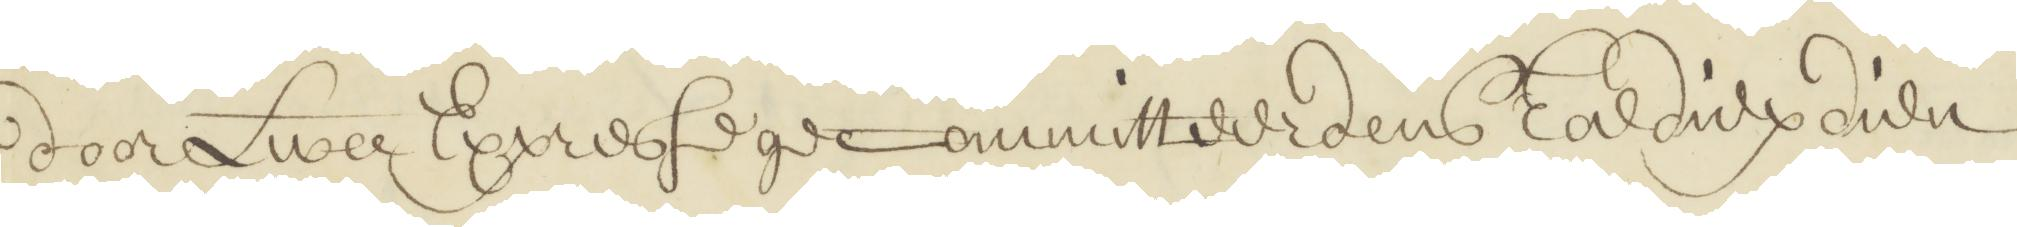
door twee Expresse gecommitteerdens hoe diep dien
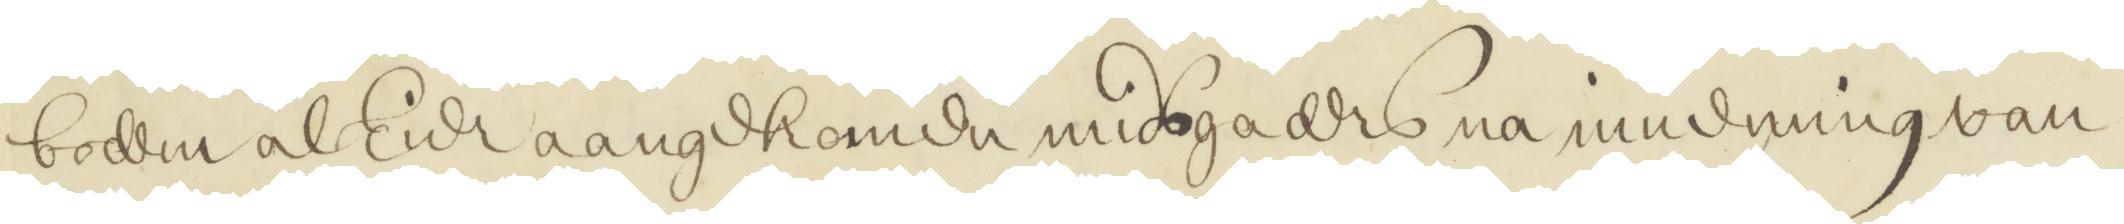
bodem alhier aangekomen midsgaders na inneming van
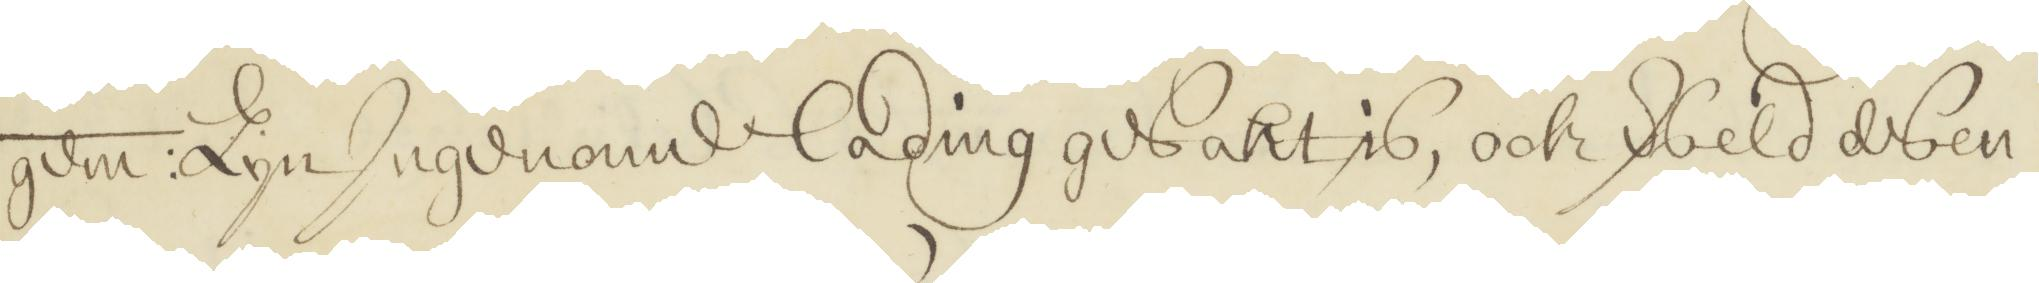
gem: zijn Jngenome lading gesakt is, ook verseld desen
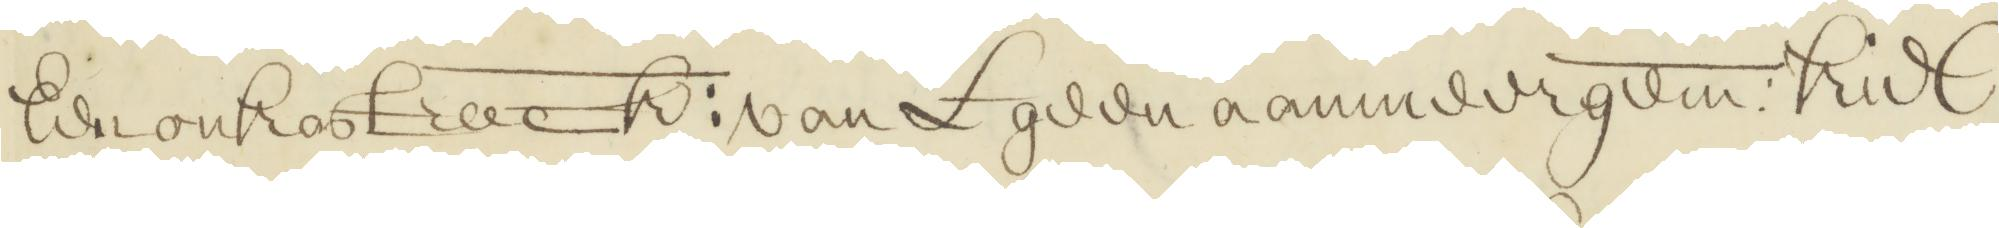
Een onkostreeck: van 't geen aanmeergem: kiel
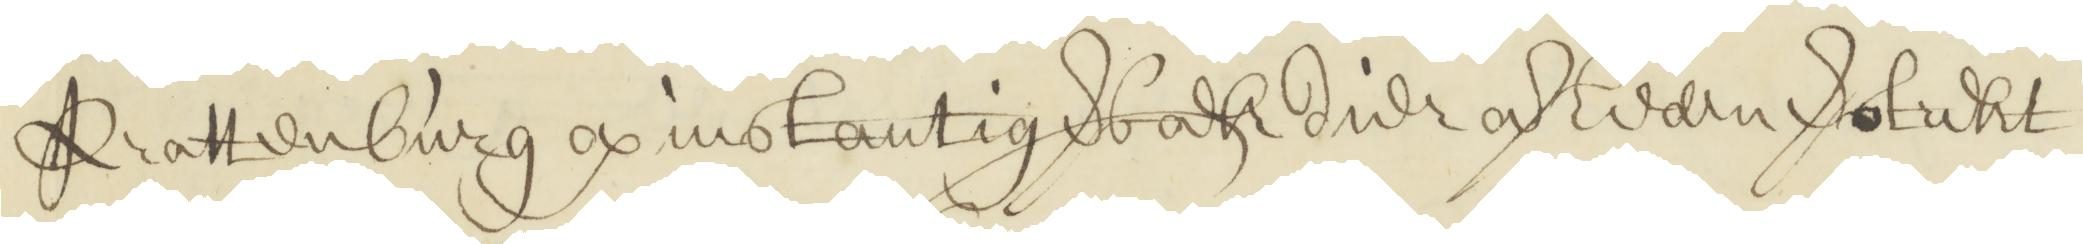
Prattenburg op instantig versoek dier overheden verstrekt
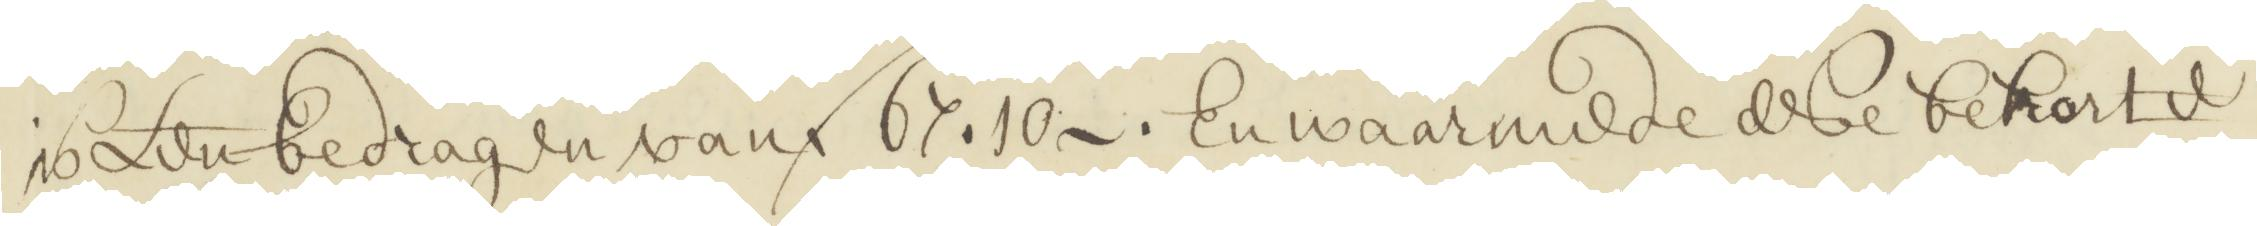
is ten bedragen van ƒ 67.10—. En waarmede dese bekorte
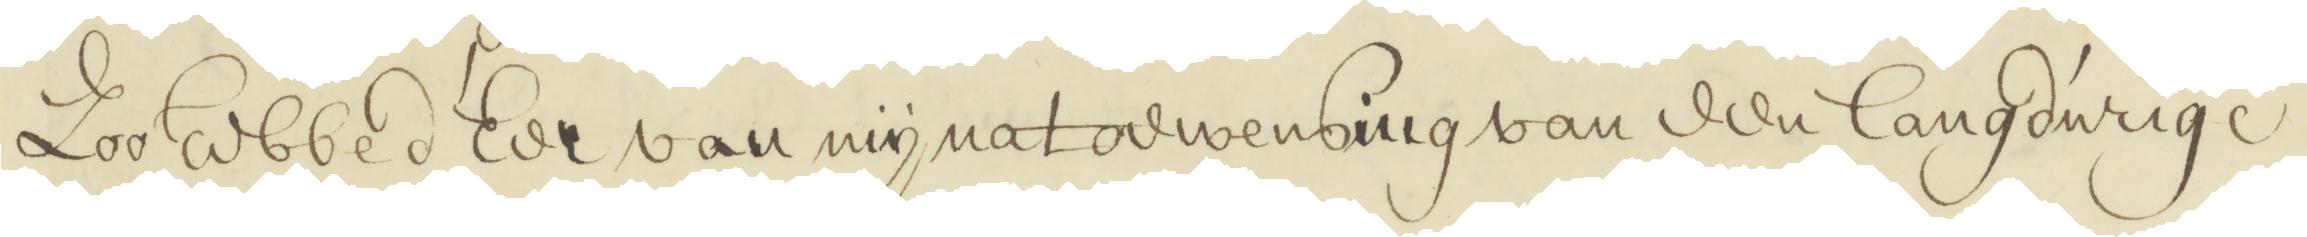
zoo hebbe d’ Eer van mij na toewensing van een langdurige
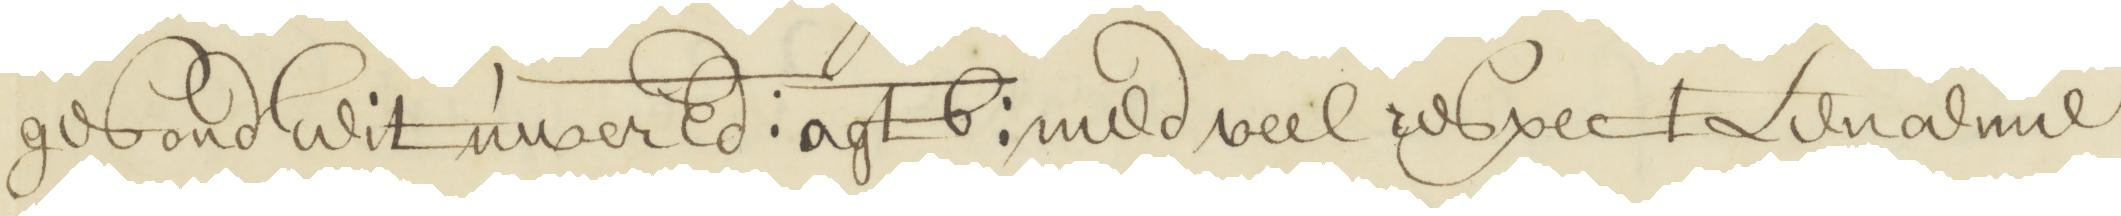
gesondheit uwer Ed: agtb: med veel respect tenaeme
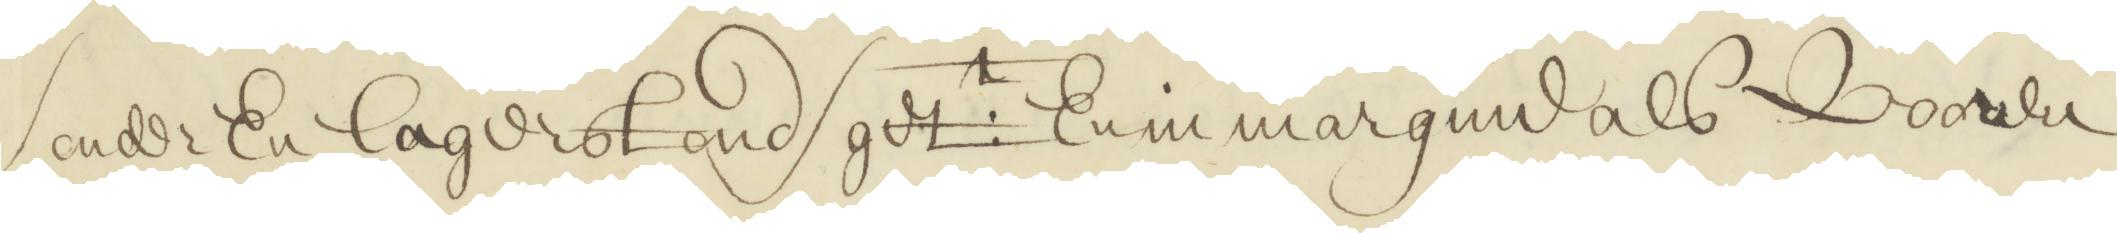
/onder En lagerstond/ get:t En in margine als vooren
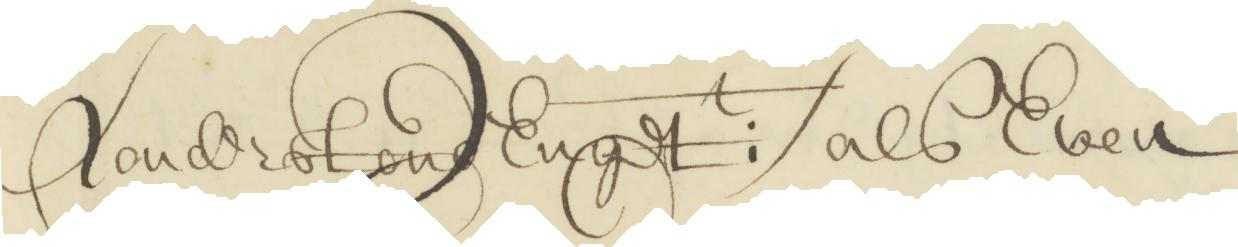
/onderstond Enget:t/ als Even.
